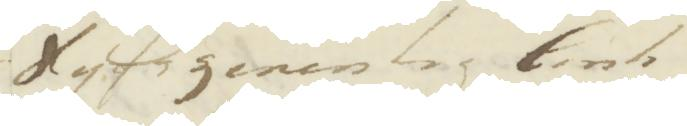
Vyfenzeventig Cent
